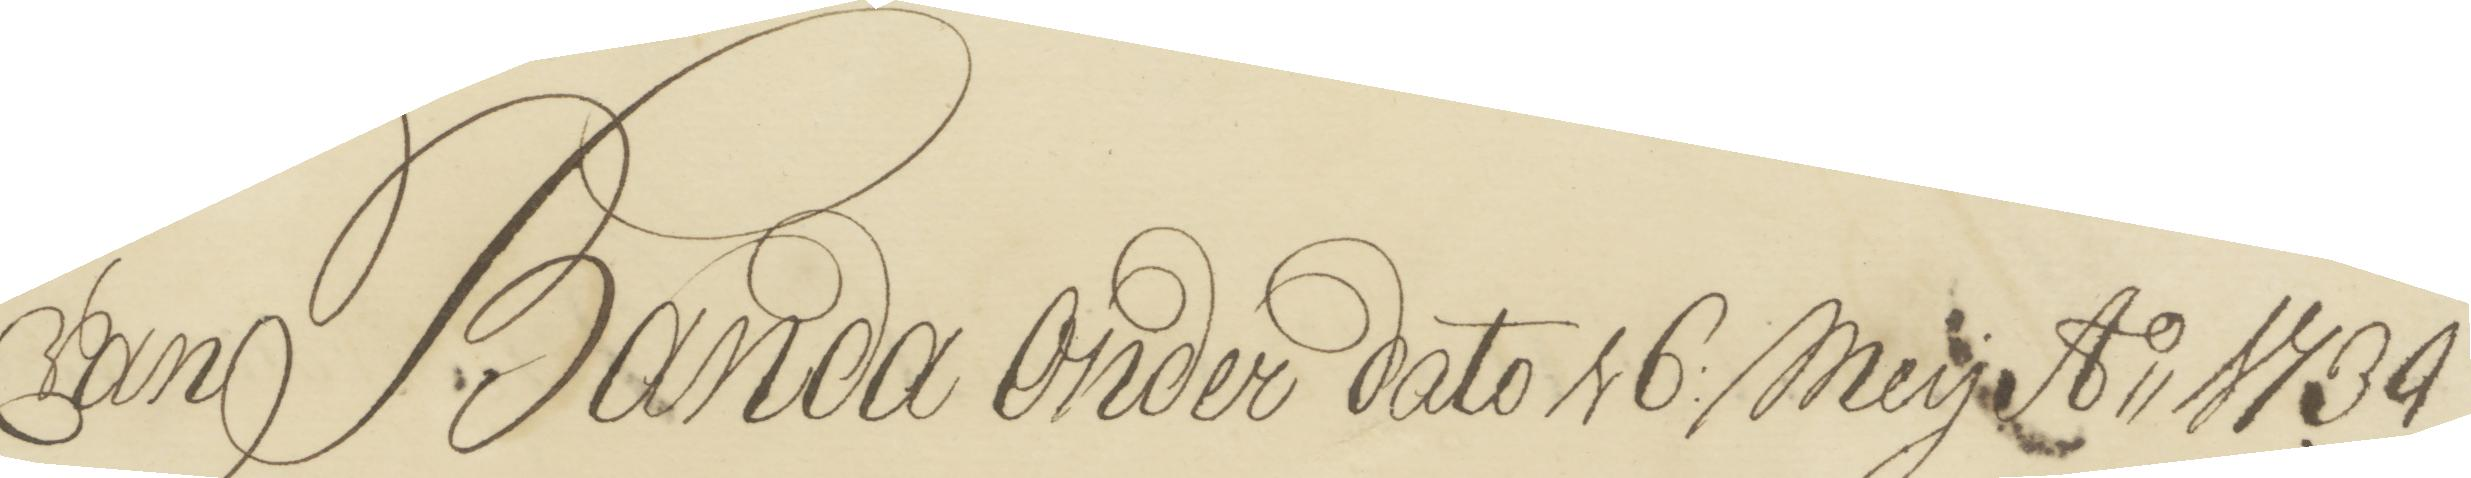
Van Banda onder dato 16: meij A„o 1734
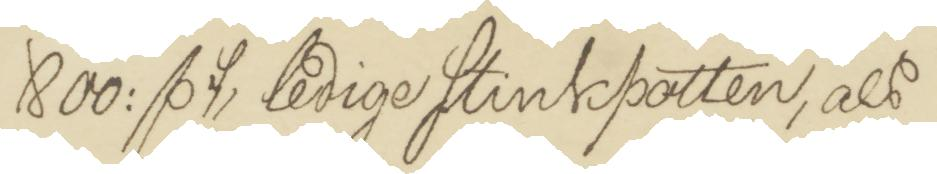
800: p„s ledige Stinkpotten, als
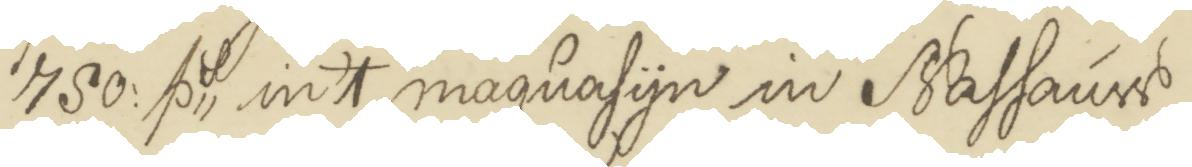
750: p„s in ’t maguasijn in Nassauw
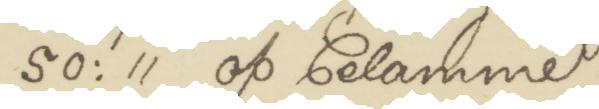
50: „ op Celamme
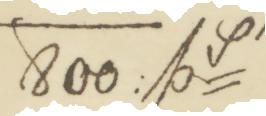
800: p=s
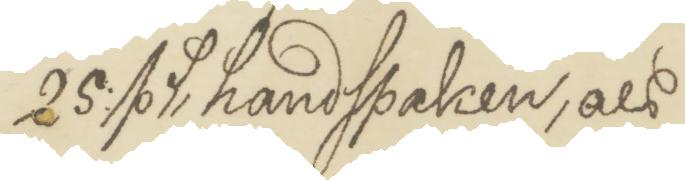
25. p„s handspaken, als
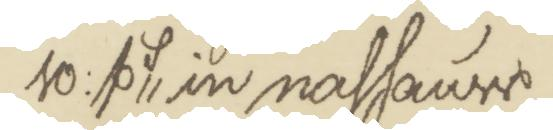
10: p„s in nassauw
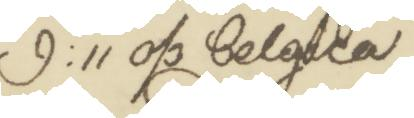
9:„ op belgica
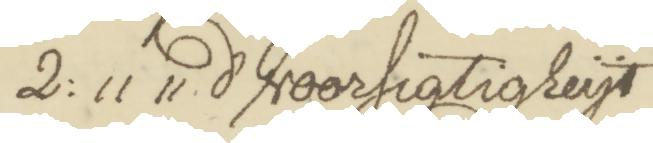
2: „ „ d’ voorsigtigheijt
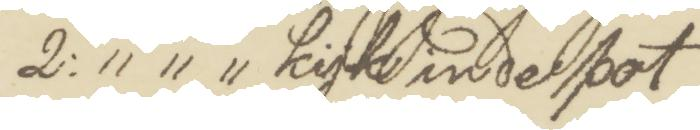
2: „ „ „ kijk in de pot
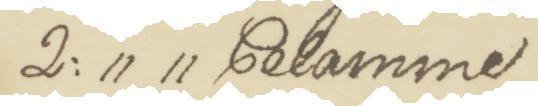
2: „ „ Celamme
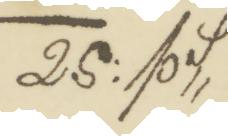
25: p„s
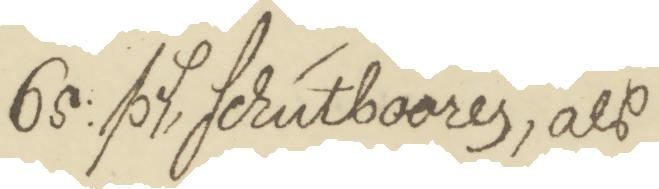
65: p„s schutbooren, als
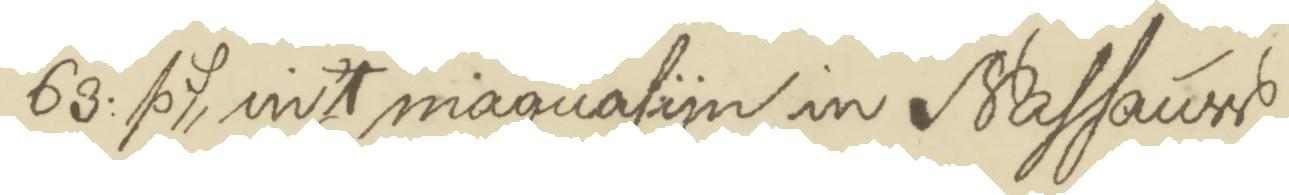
63: p„s in ’t maguasijn in Nassauw
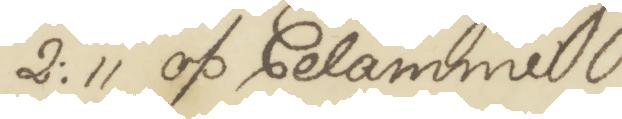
2: „ op Celamme
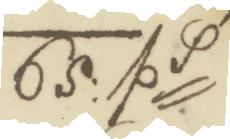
65: p„s
